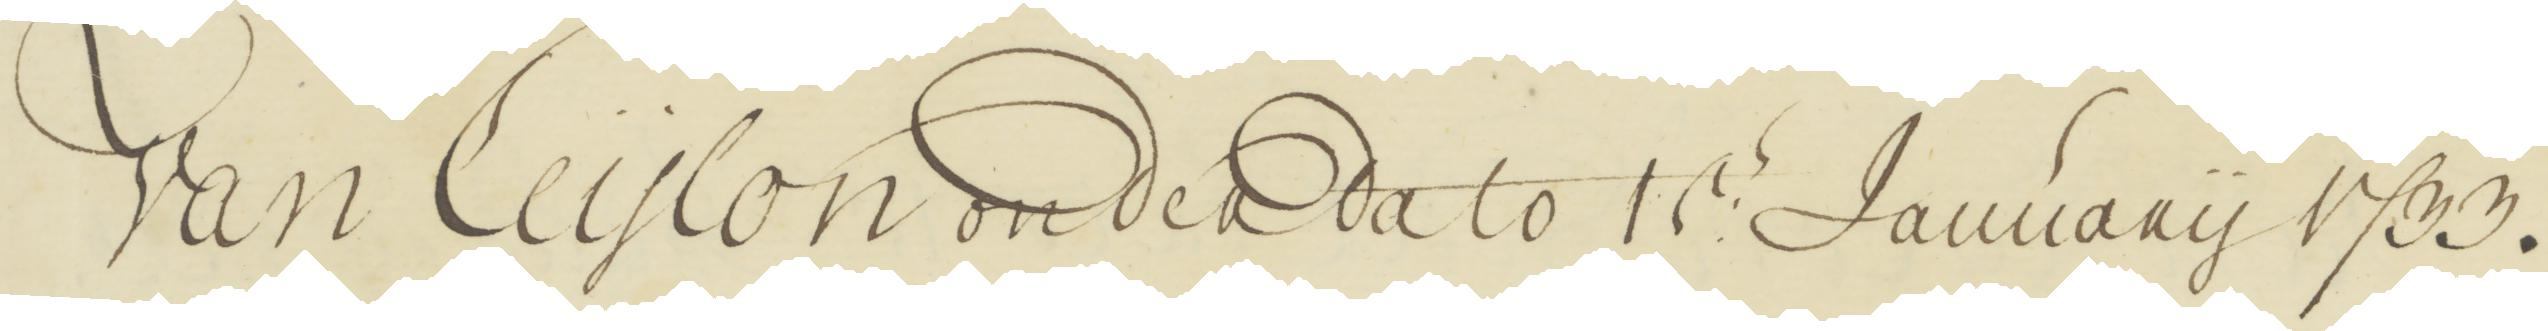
Van Ceijlon onder dato 15:e Ianuarij 1733.
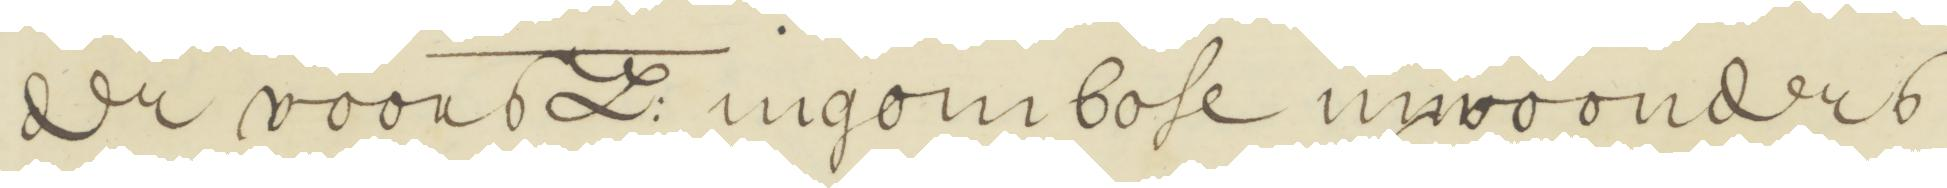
der voorsz: ingombose inwoonders
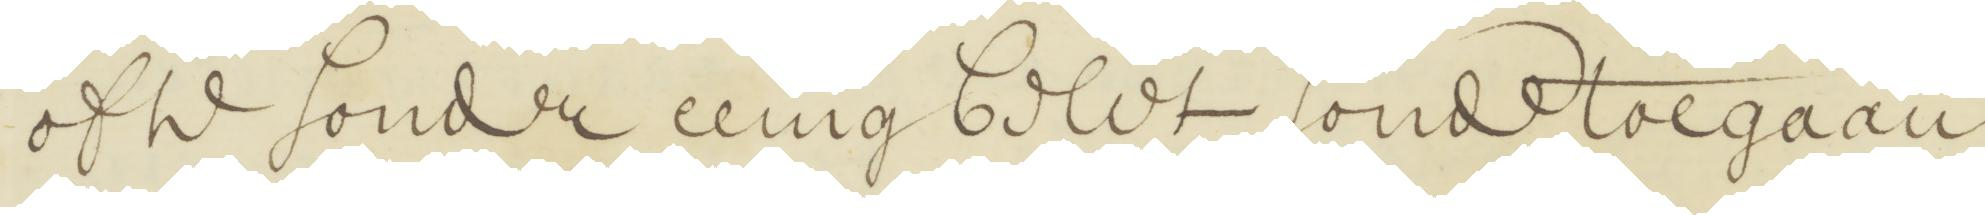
ofte Sonder eenig belet Soude toegaan
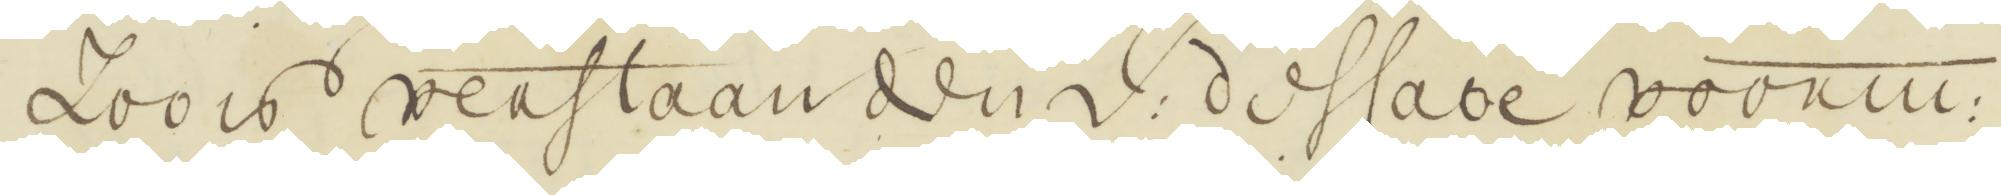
Zoo is verstaan den E: dessave voorm:
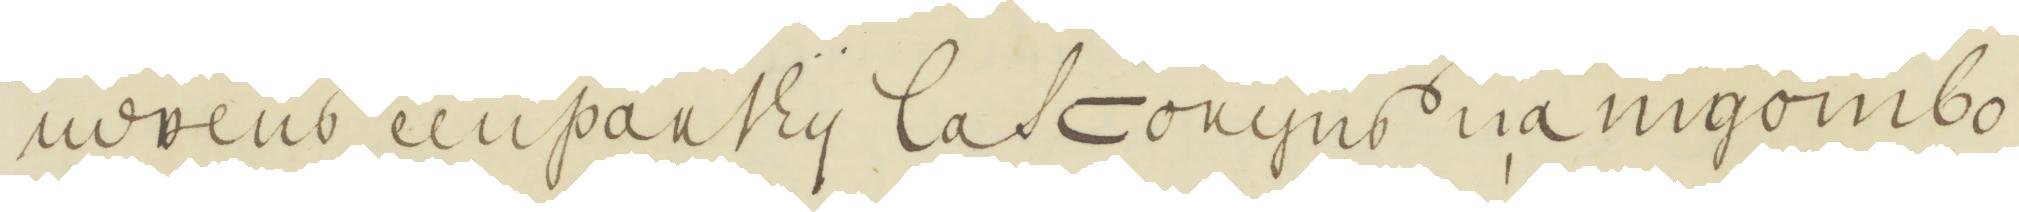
nevens een parthij lascoryns na ingombo
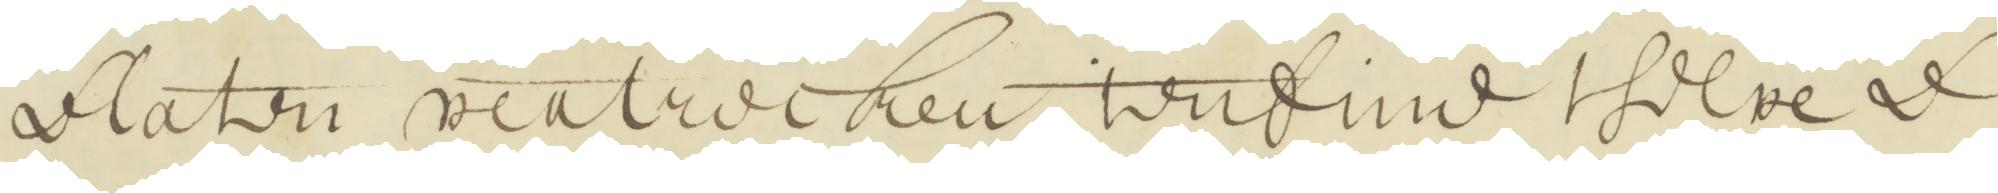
telaten vertrecken ten fine 'tselve te
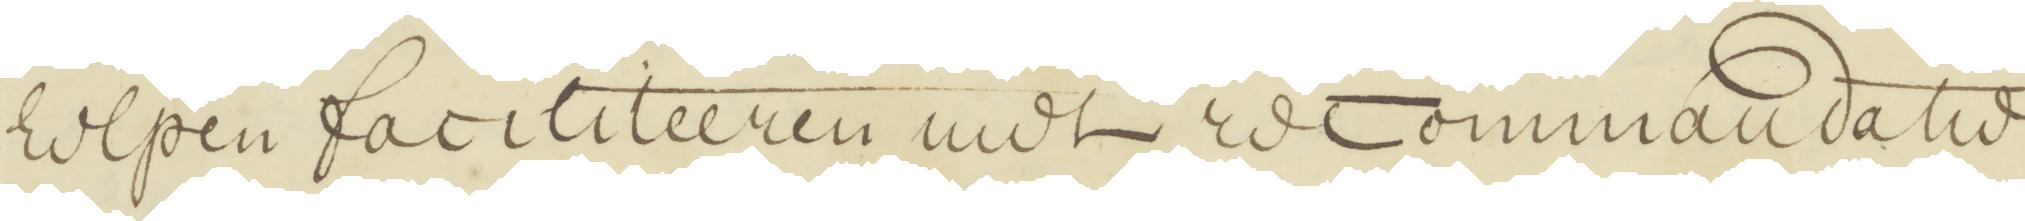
helpen faciliteeren met recommandatie
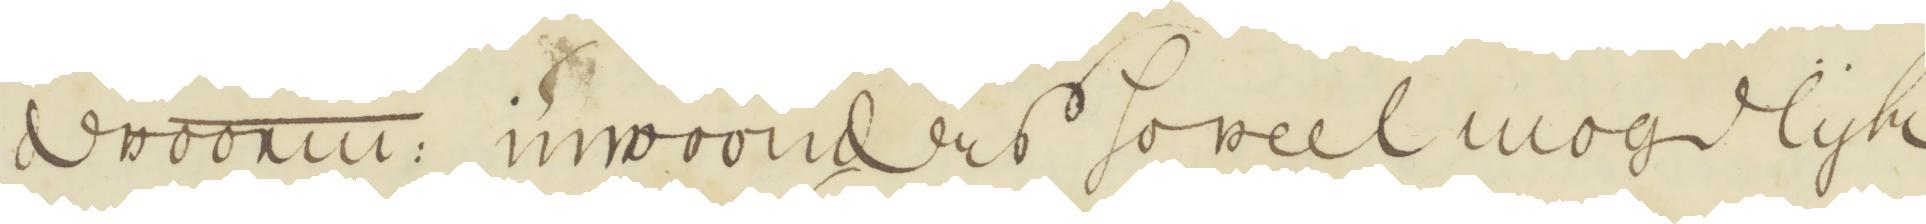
de voorm: inwoonders soveel mogelijk
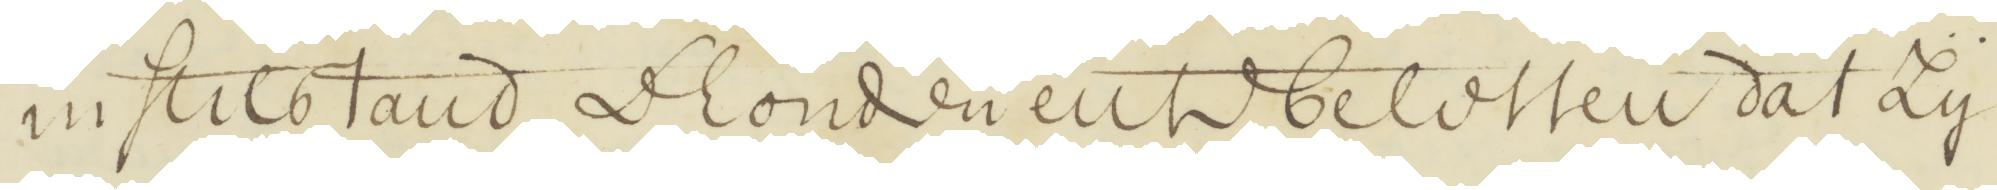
in Stilstand tehouden en te beletten dat Zij
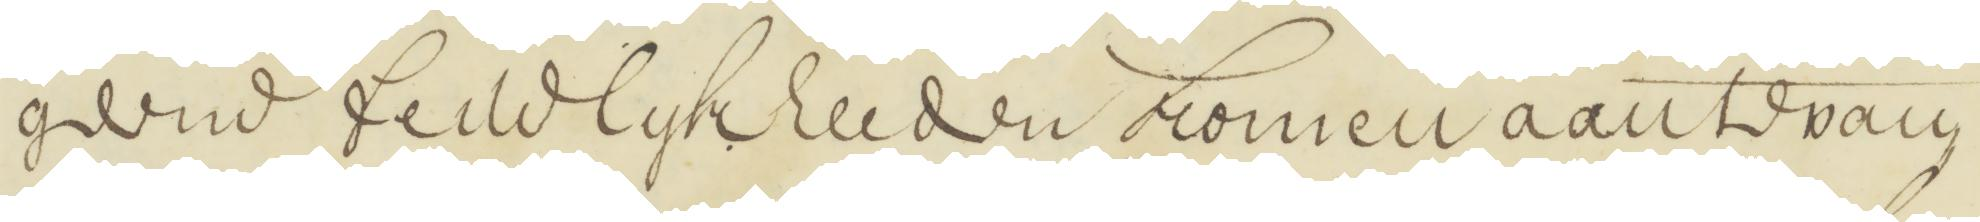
geene feitellykheeden komen aan te van
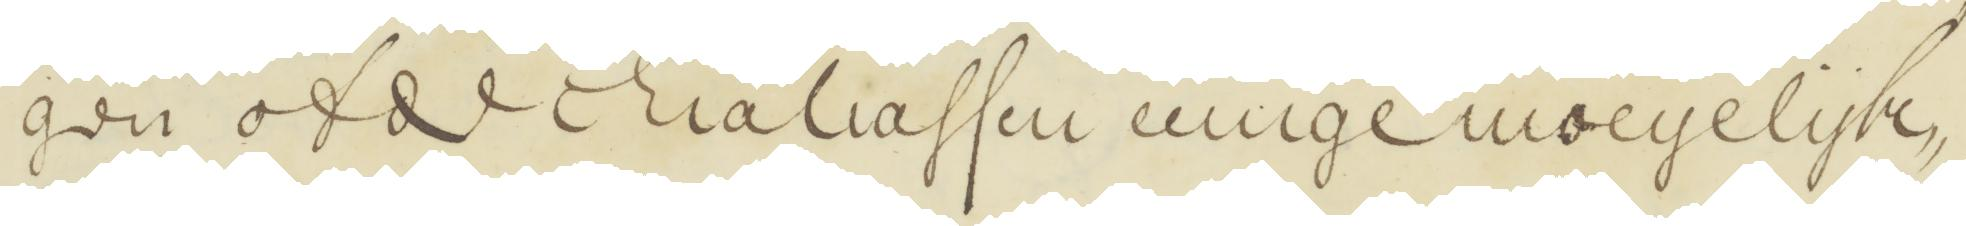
gen of de Chialiassen eenige moeijelijk„
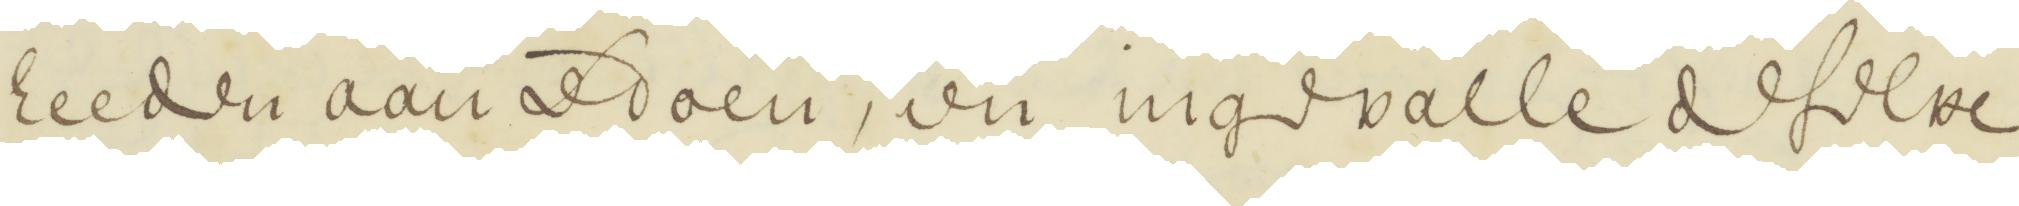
heeden aan te doen, en ingevalle deselve
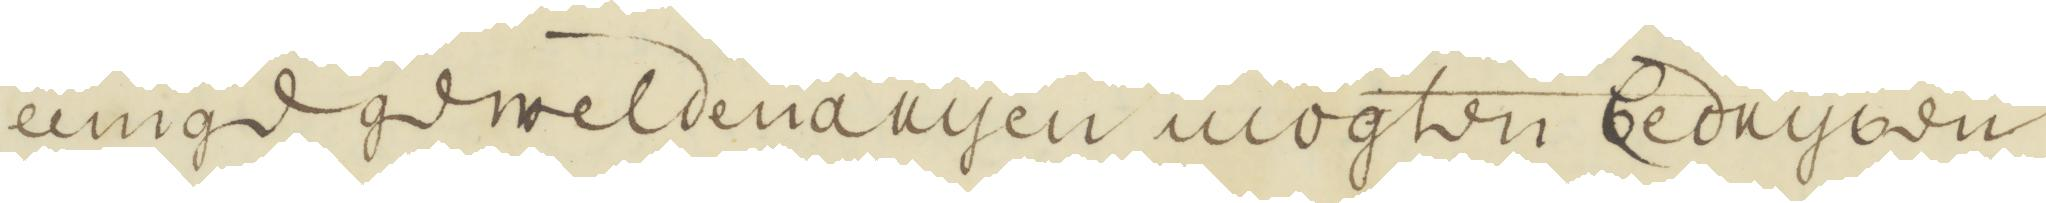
eenige geweldenarijen mogten bedrijven
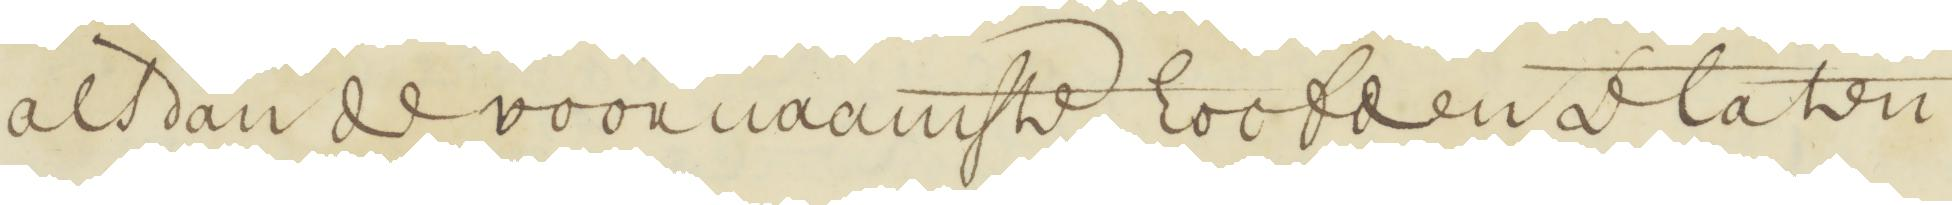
als dan de voornaamste hoofden te laten
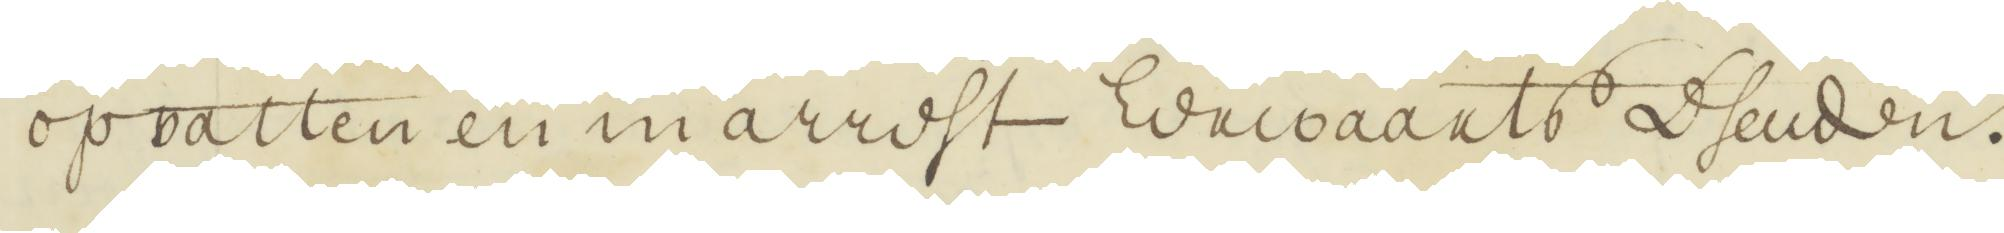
opvatten en in arrest herwaarts tesenden.
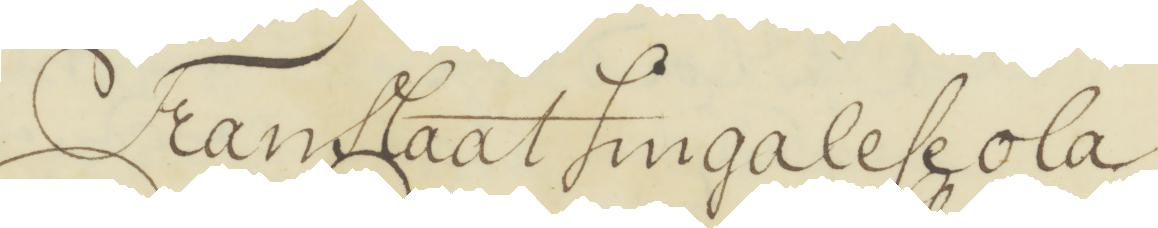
Translaat Singalese ola
